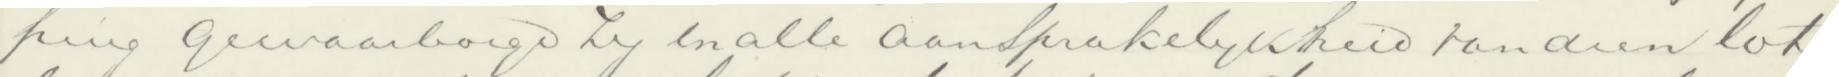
ping gewaarborgd zy in alle aansprakelykheid van dien lote
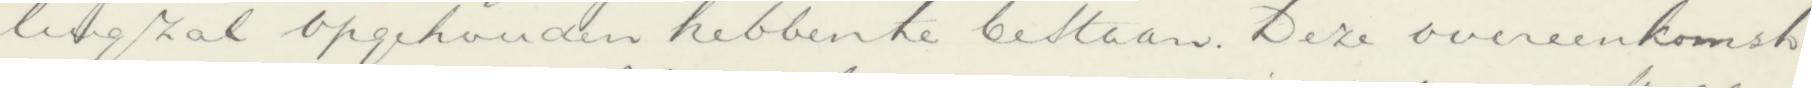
ling zal opgehouden hebben te bestaan. Deze overeenkomst
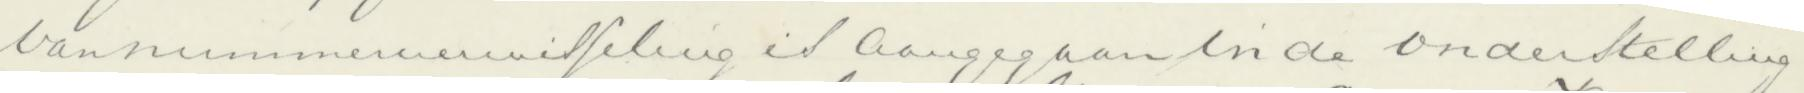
van nummervewisseling is aangegaan in de onderstelling
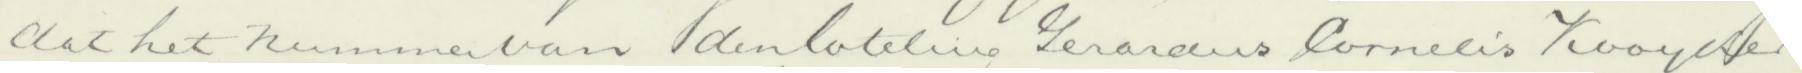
dat het Nummer van den loteling Gerardus Cornelis Kooyker
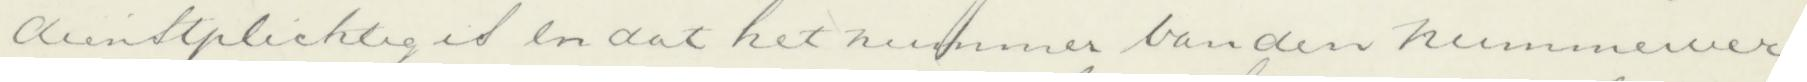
dienstplichtig is en dat het nummer van den Nummerver.
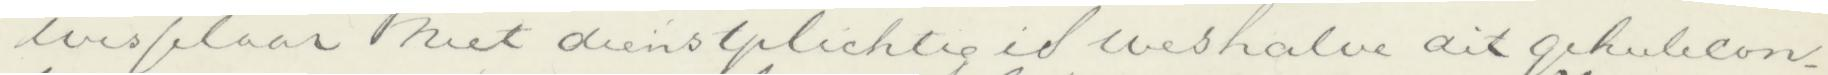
wisselaar niet dienstplichtig is weshalve dit geheele con-
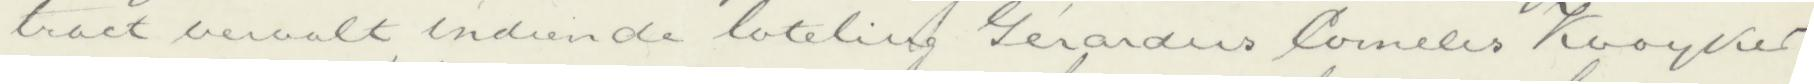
tract vervalt indien de loteling Gerardus Cornelis Kooyker
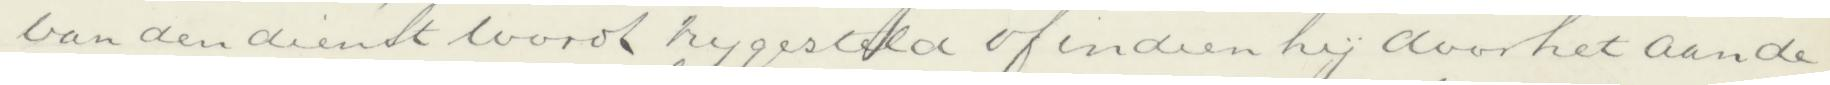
van den dienst wordt vrygesteld of indien hij door het aan de
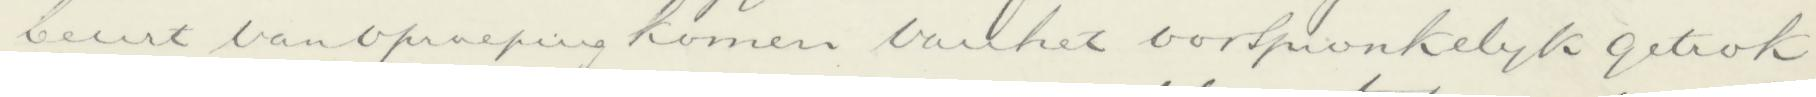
beurt van oproeping komen van het oorspronkelyk getrok
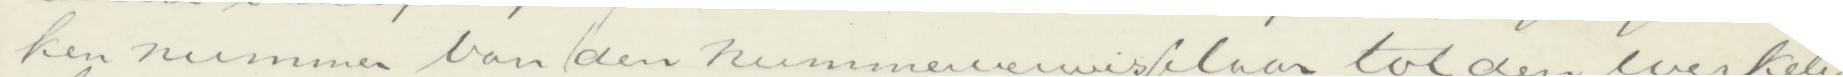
ken nummer van den Nummerverwisselaar tot den werkely
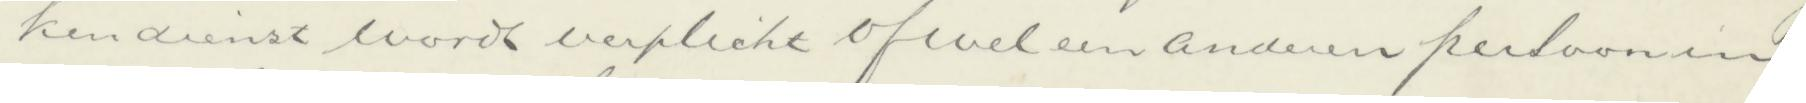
ken dienst wordt verplicht of wel een anderen persoon in
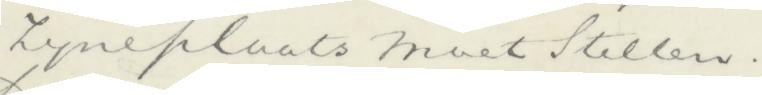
zyne plaats moet stellen.
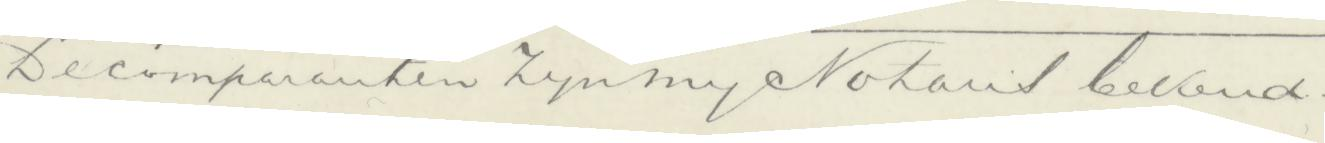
De comparanten zyn my Notaris bekend
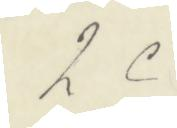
2 C
